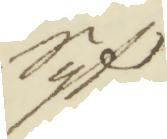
Vyf
